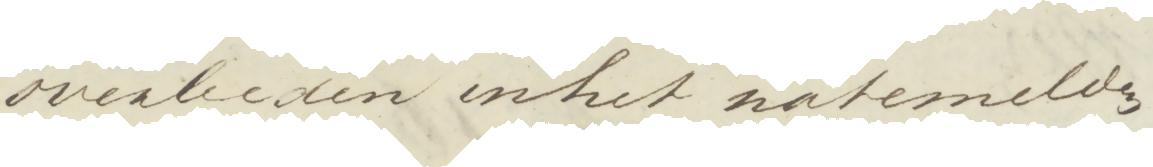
overleeden in het natemelden
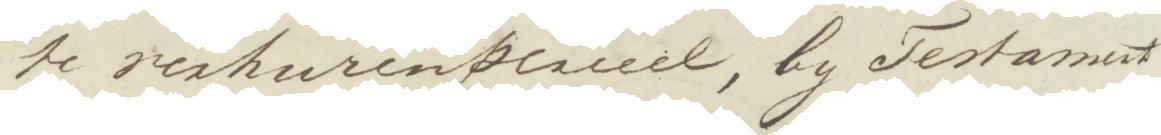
te verhuren perceel, by Testament
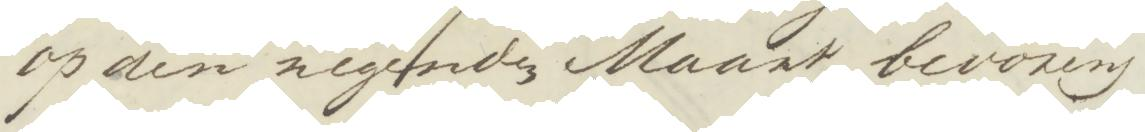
op den negende Maart bevorens
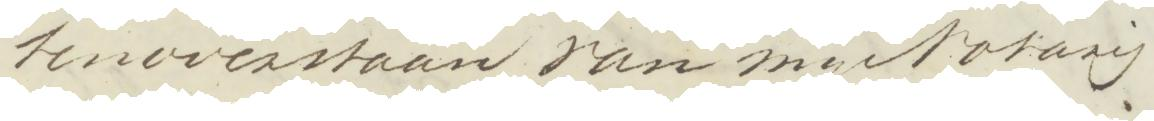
ten overstaan van my Notaris
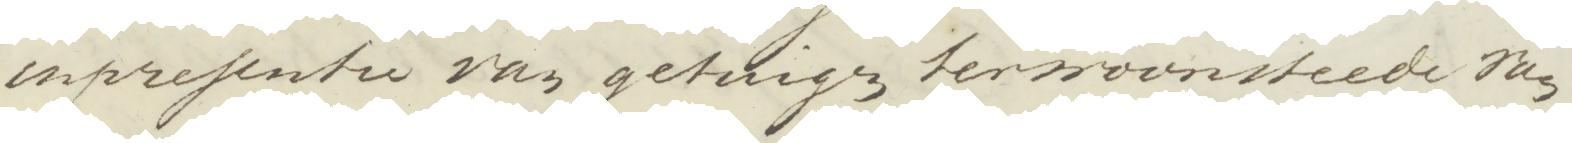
in presentie van getuigen ter woonsteede van
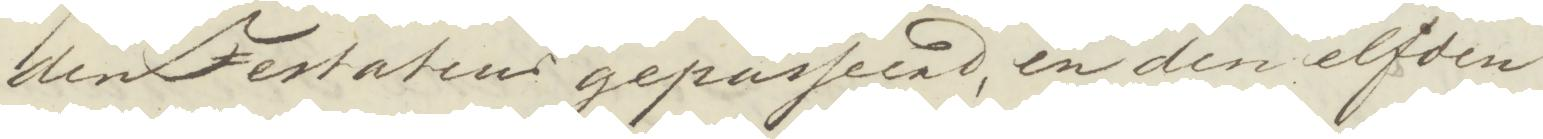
den Testateur gepasseerd, en den elfden
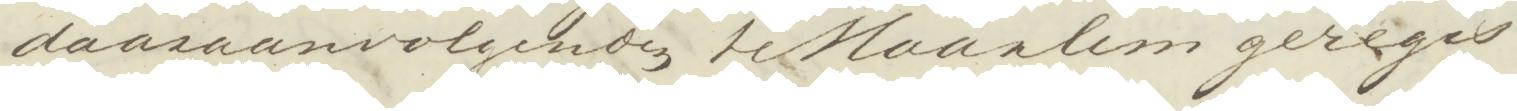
daaraanvolgende te Haarlem geregis:
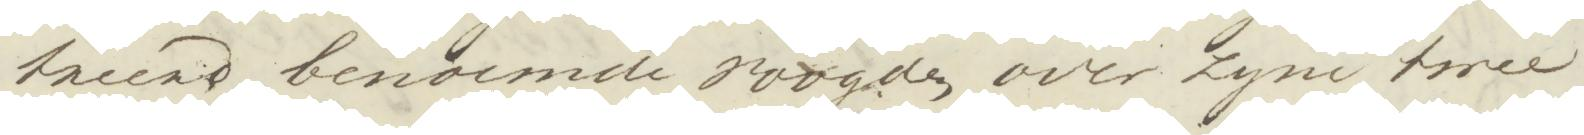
=treerd, benoemde voogden over zyne twee
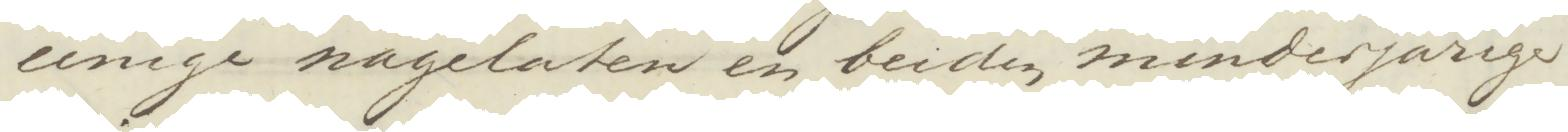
eenige nagelaten en beiden minderjarige
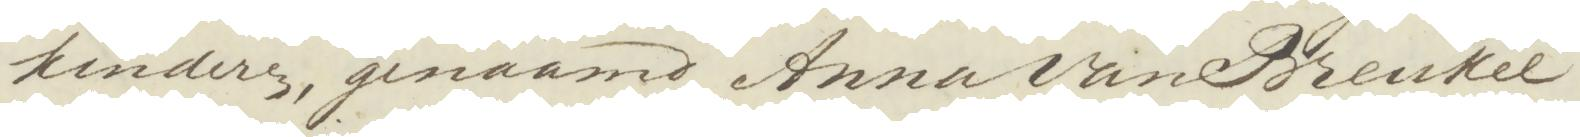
kinderen, genaamd Anna van Breukel
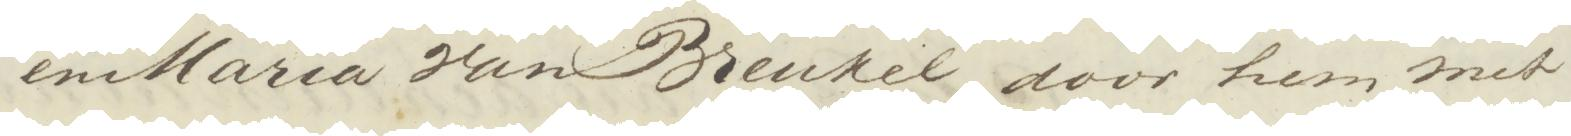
en Maria van Breukel, door hem met
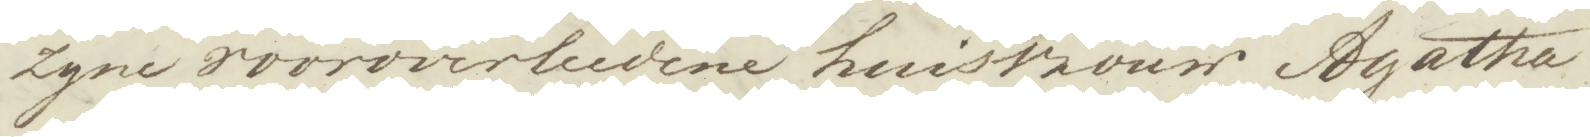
zyne vooroverleedene huisvrouw Agatha
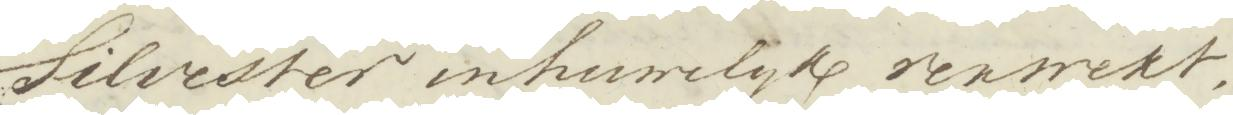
Silvester in huwelyk verwekt,
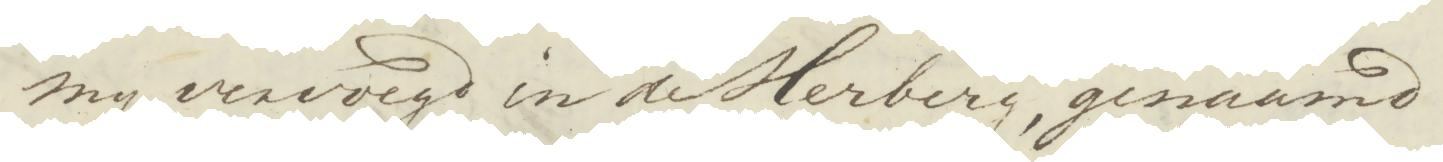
my vervoegd in de Herberg, genaamd
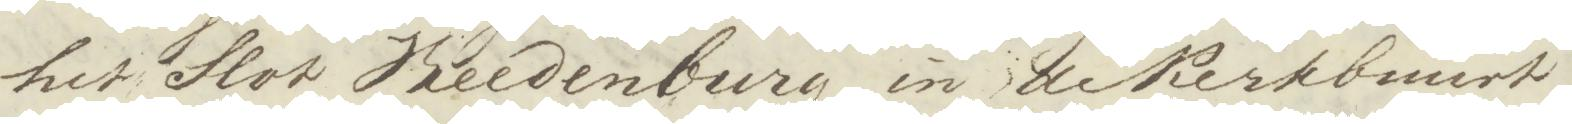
het Slot Vreedenburg in de Kerkbuurt
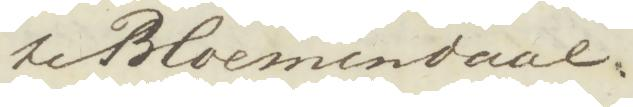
te Bloemendaal:
